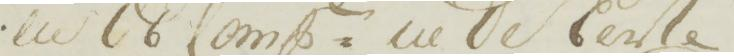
en DE Comp=e in de Eerste
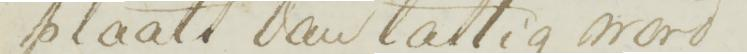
plaats dan lastig word
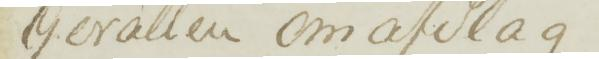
gevallen om afslag
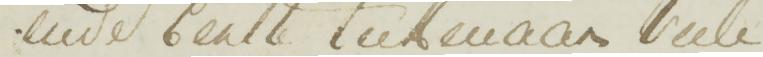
ende Eerste teekenaar veele
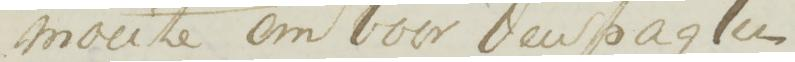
moeite om voor den pagten
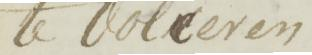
te doleeren
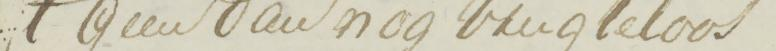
't geen dan nog vrugteloos
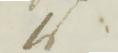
is:
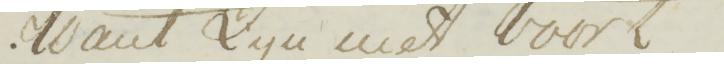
want zyn niet voor't
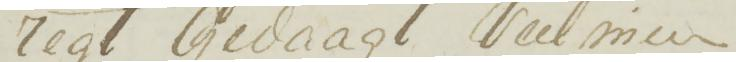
regt gedaagt veel min
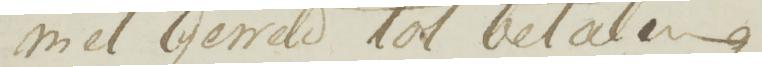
met geweld tot betaling
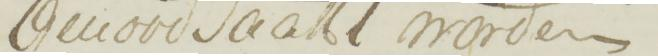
genoodsaakt worden
